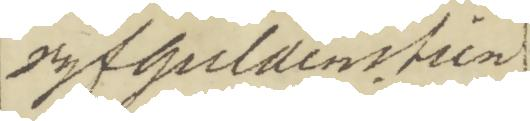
vyf Guldens tien
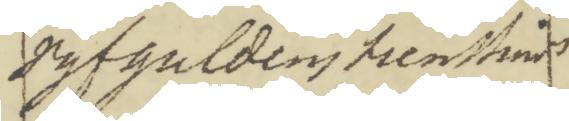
Vyf guldens tien stuivs
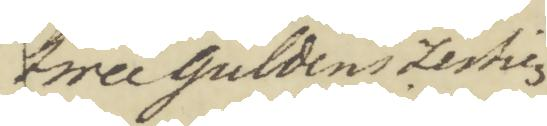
twee Guldens zestien
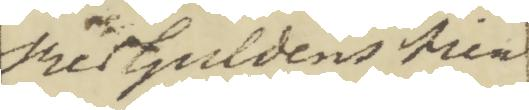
Vier Guldens tien
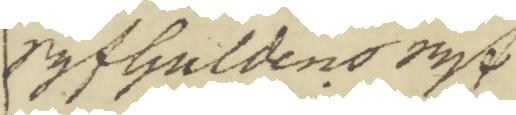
Vyf Guldens vyf
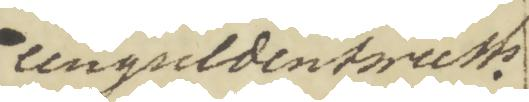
een gulden twee st.s
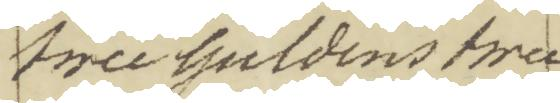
twee Guldens twee
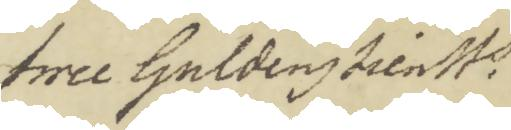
twee Guldens tien st.s
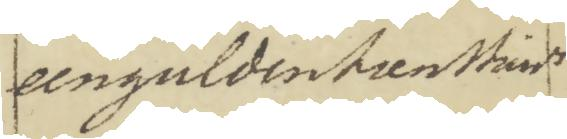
een gulden tien stuivs
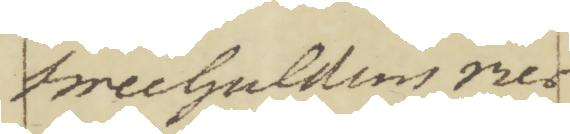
twee Guldens vier
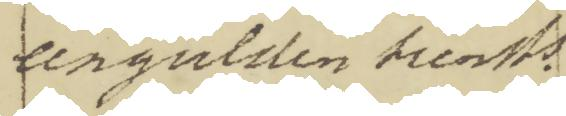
een gulden tien st.s
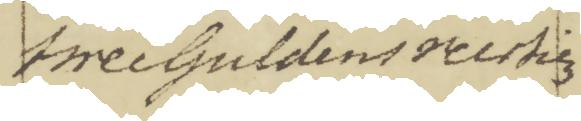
twee Guldens veertien
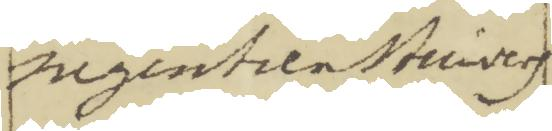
negentien stuivers
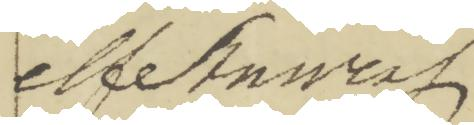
elf Stuivers
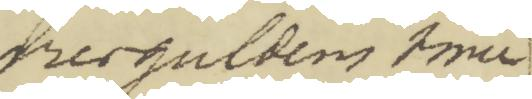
vier guldens twee
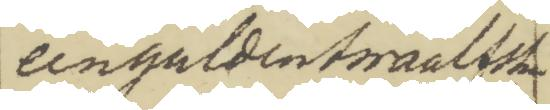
een gulden twaalf stui
